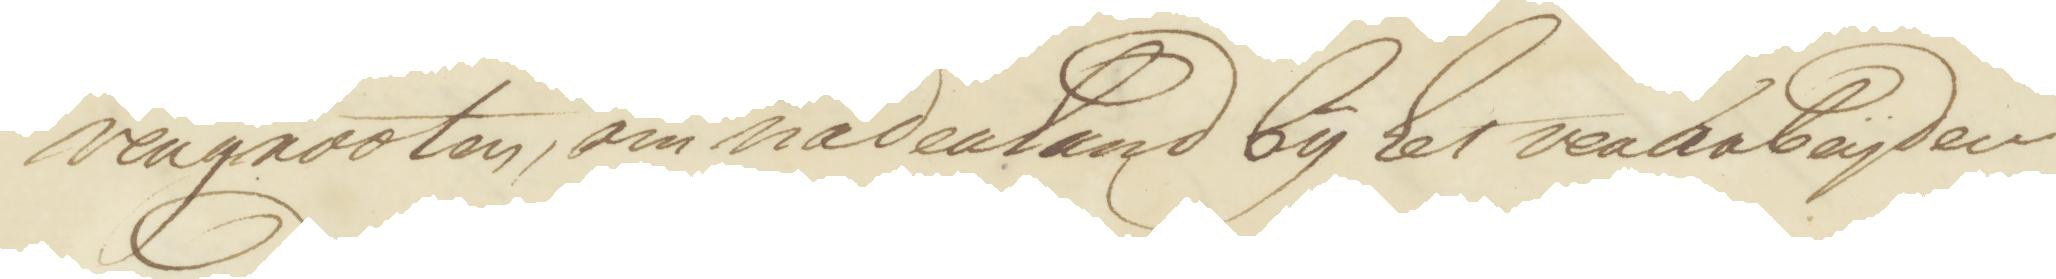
vergrooten, om naderhand bij het verarbeijden
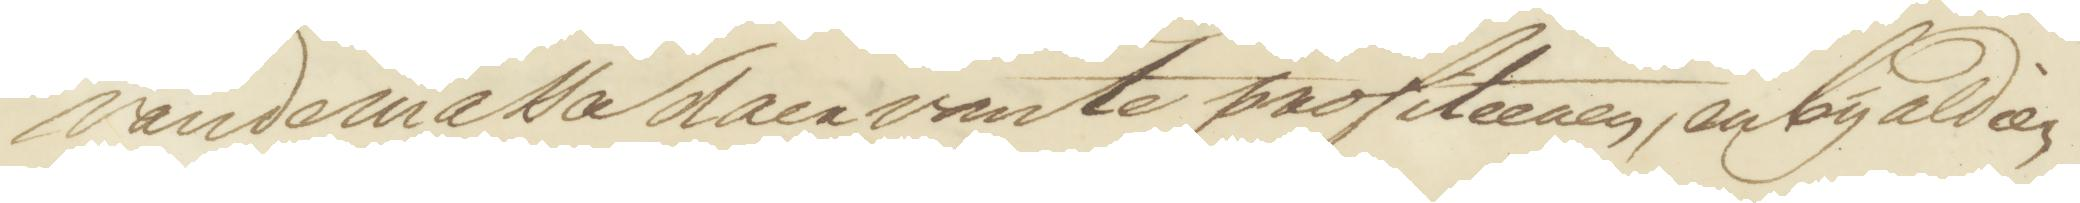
van de massa daer van te profiteeren, en bij aldien
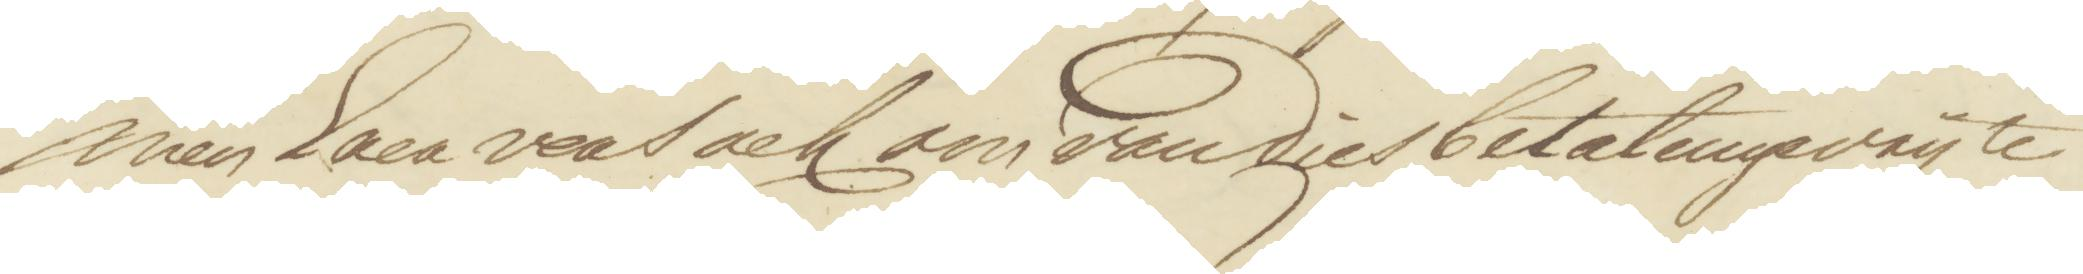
men haer versoek om van dies betalenge vrij te
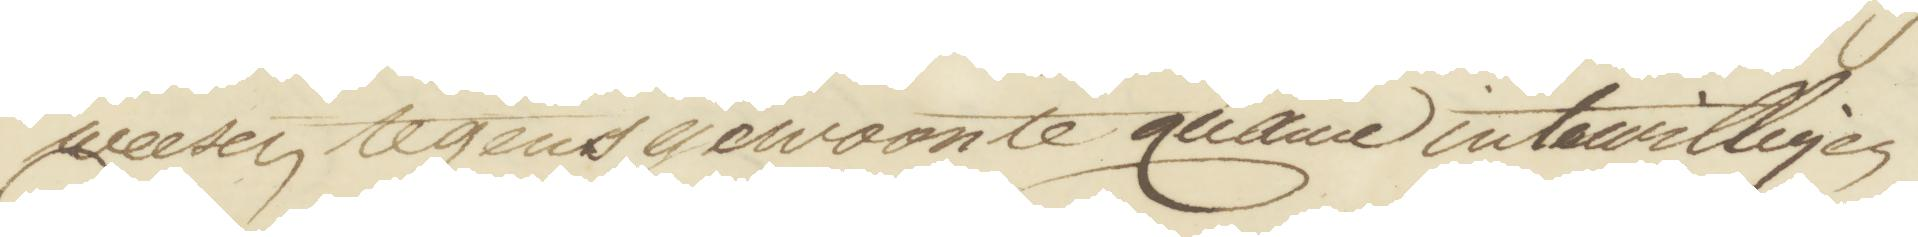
weesen tegens gewoonte quame intewilligen
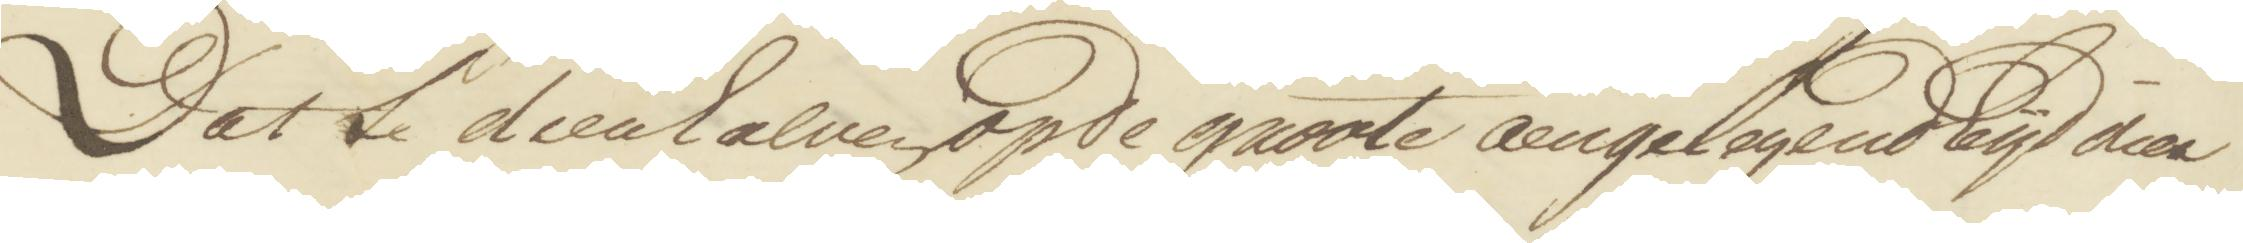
Dat se dierhalven op de groote aengelegendheijd dier
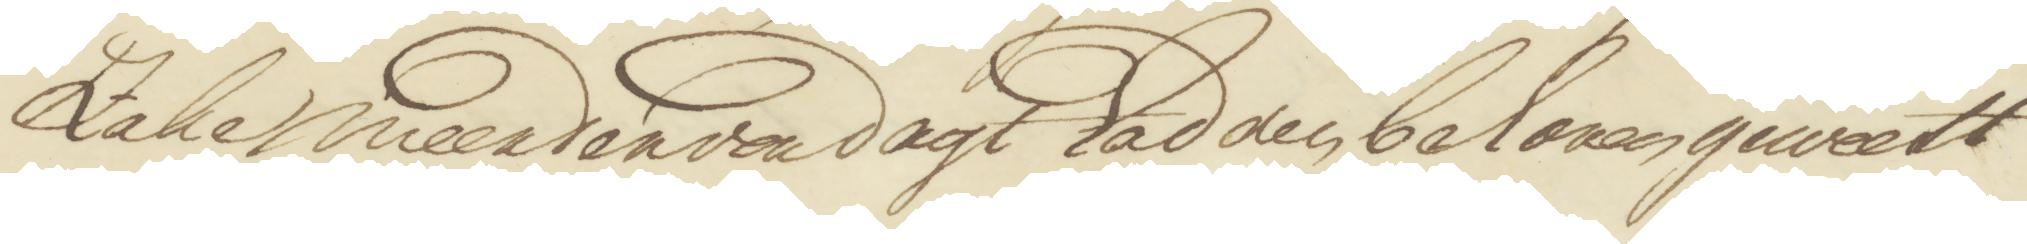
zake meerder verdagt hadden behoren geweest
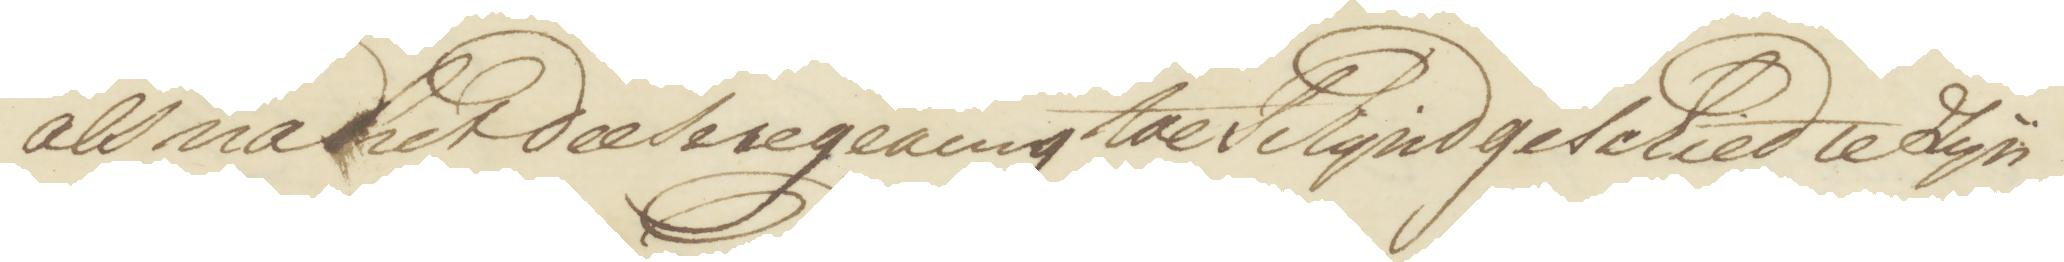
als na het deeseregering toeschijnd geschied te zijn
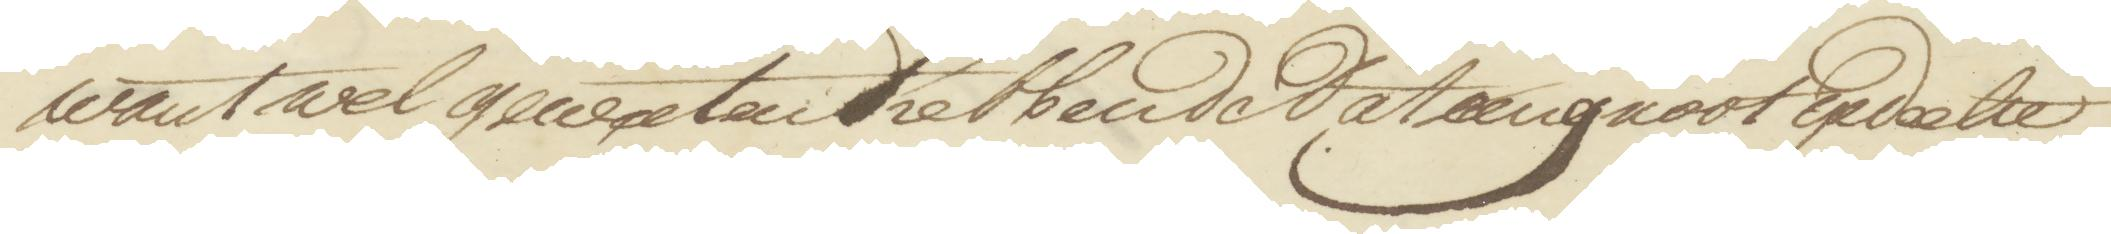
want wel geweeten hebbende dat een groot gedeelte
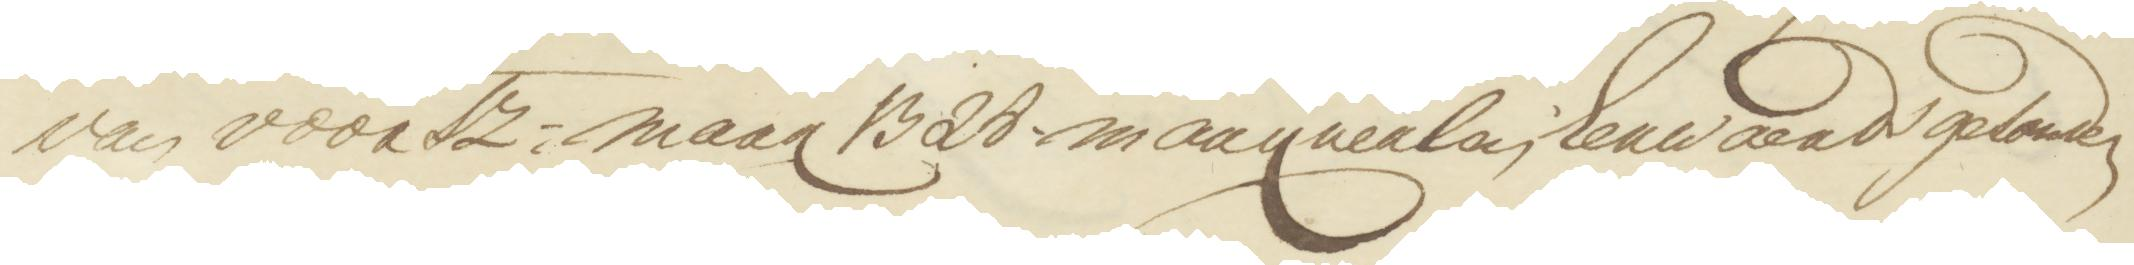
van voorsz: maaq 1328. maaqrealen herwaerds gesonden
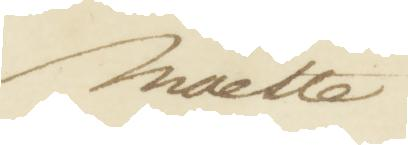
moette
